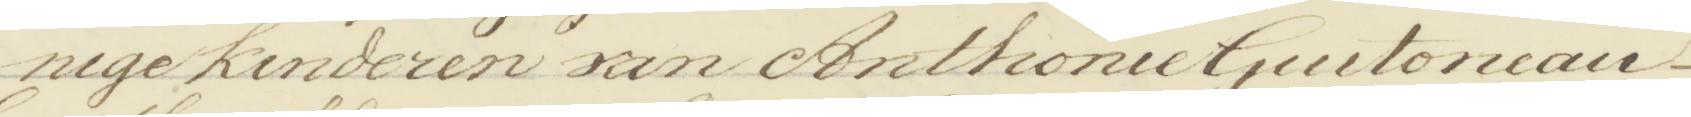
nige kinderen van Anthonie Guitoneau
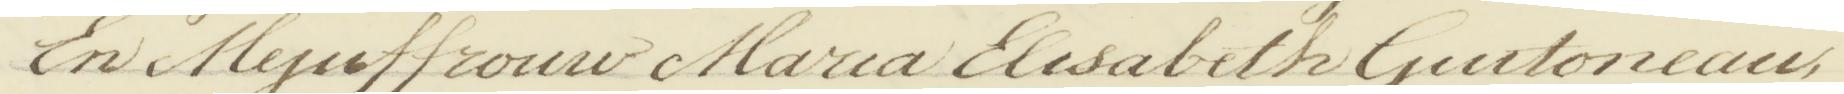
En Mejuffrouw Maria Elisabeth Guitoneau,
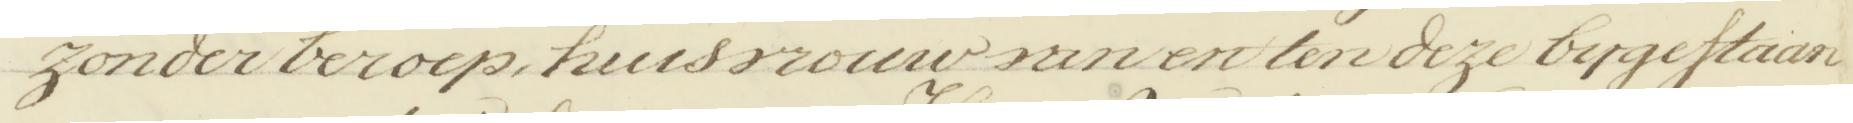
zonder beroep, huisvrouw van en ten deze bygestaan
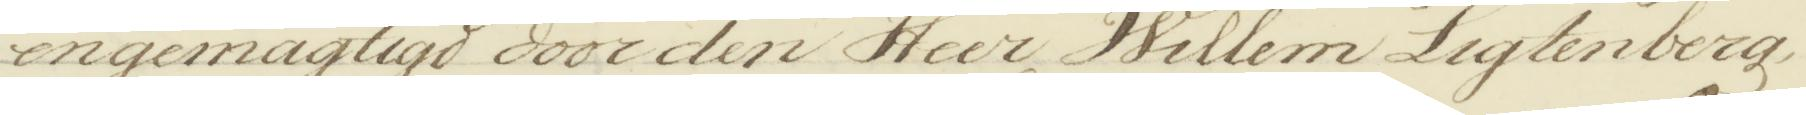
en gemagtigd door den Heer Willem Ligtenberg,
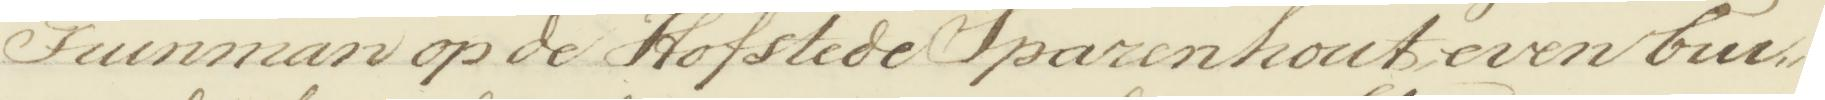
Tuinman op de Hofstede Sparenhout, even bui„
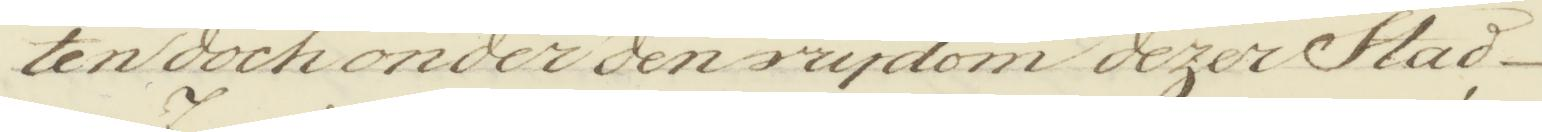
ten doch onder den vrydom dezer Stad-
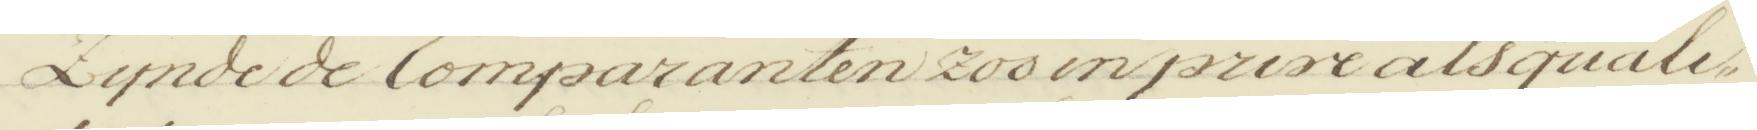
Zynde de Comparanten zoo in privé als quali„
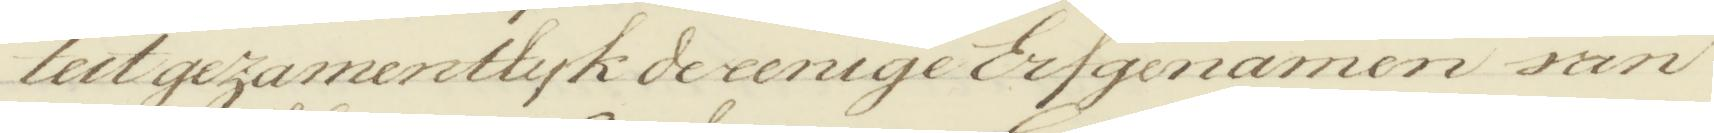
teit gezamentlyk de eenige Erfgenamen van
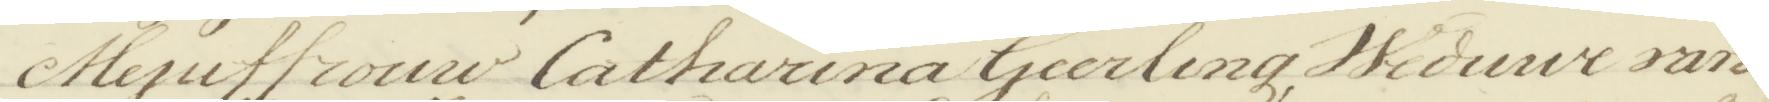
Mejuffrouw Catharina Geerling, Weduwe van
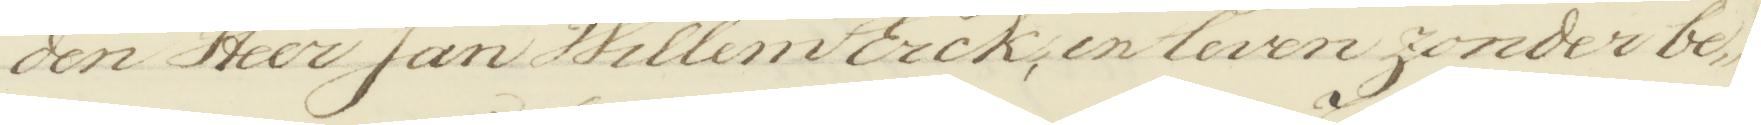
den Heer Jan Willem Erck, in leven zonder be„
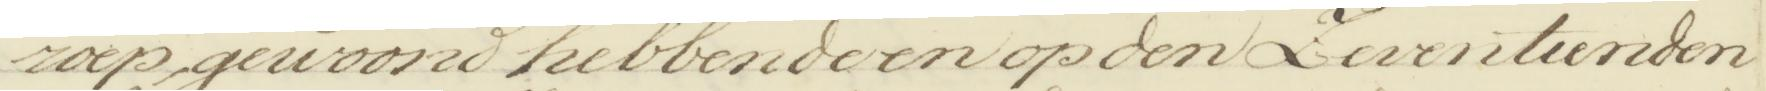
roep, gewoond hebbende en op den Zeventienden
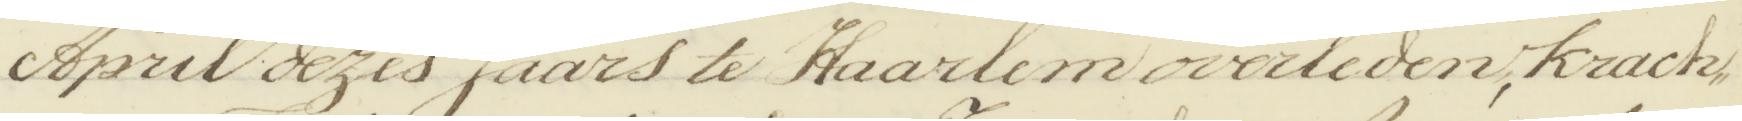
April dezes Jaars te Haarlem overleden, krach„
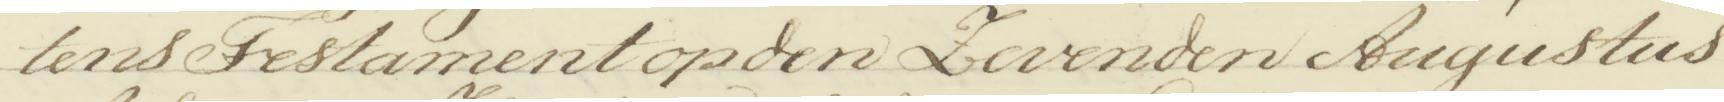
tens Testament op den Zevenden Augustus
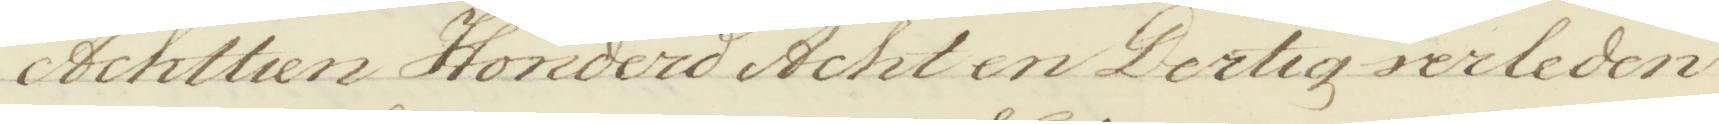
Achttien Honderd Acht en Dertig verleden
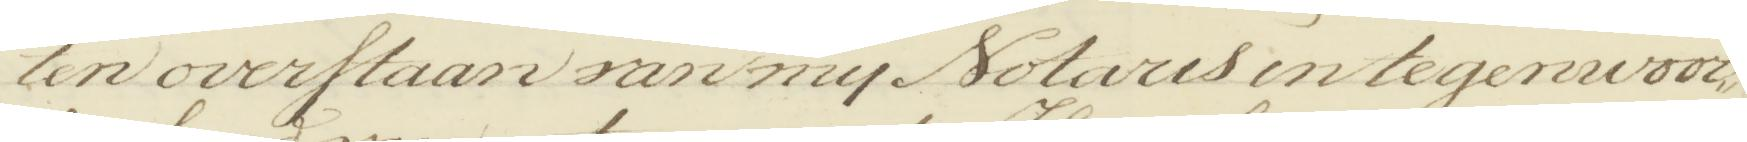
ten overstaan van my Notaris in tegenwoor„
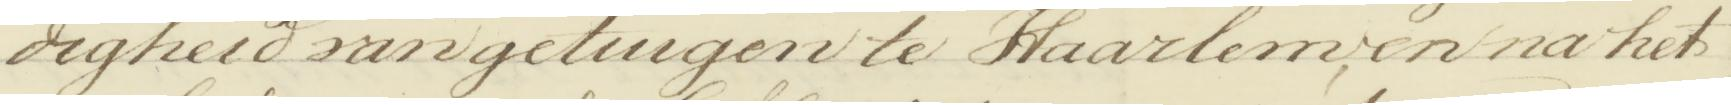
digheid van getuigen te Haarlem en na het
